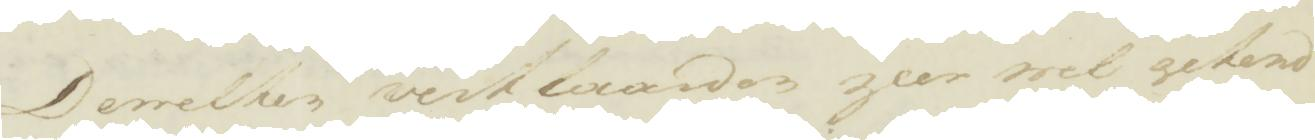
Dewelken verklaarden zeer wel gekend
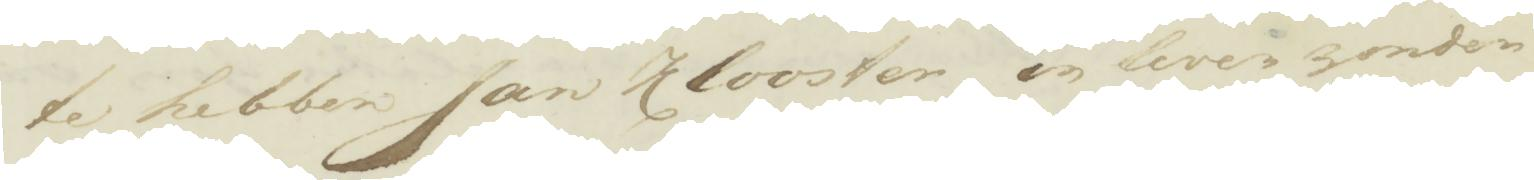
te hebben Jan Klooster in leven zonder
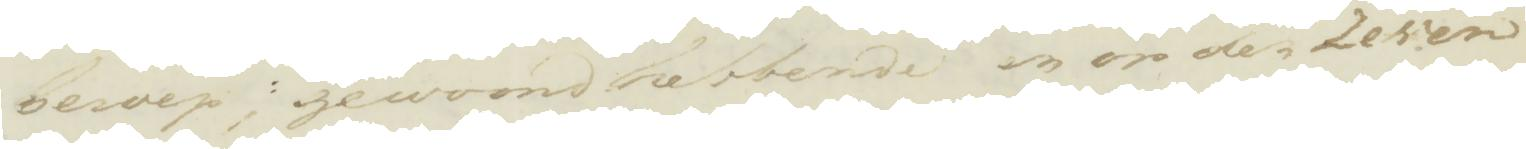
beroep; gewoond hebbende en op den Zeven
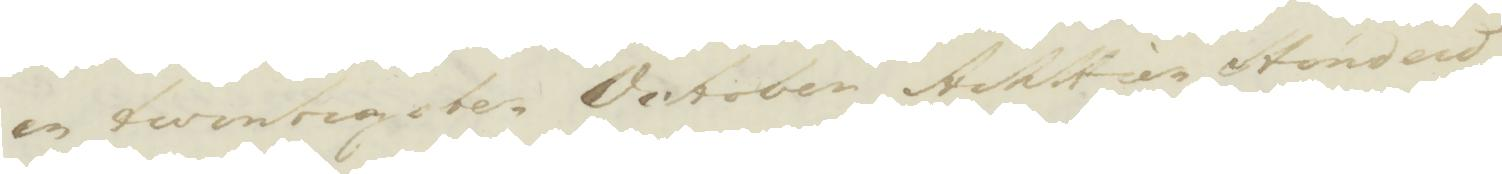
en twintigsten October Achttien Honderd
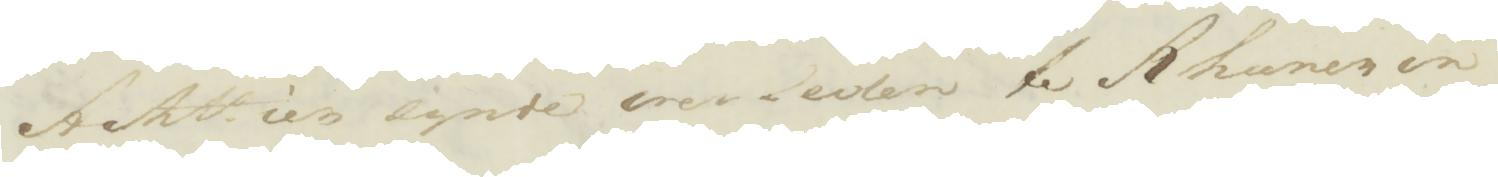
Achttien zijnde overleden te Rhunen in
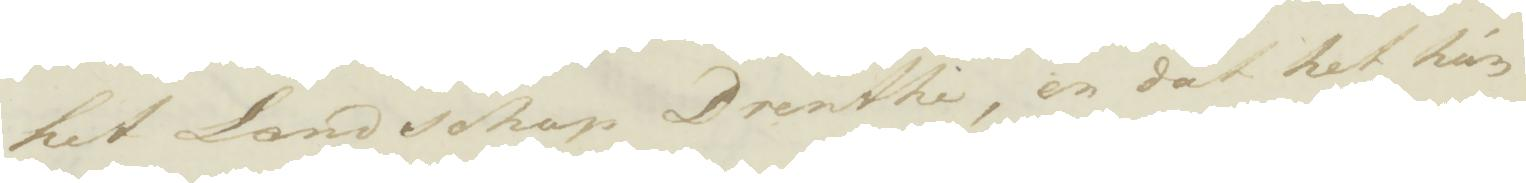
het Landschap Drenthe, en dat het hun
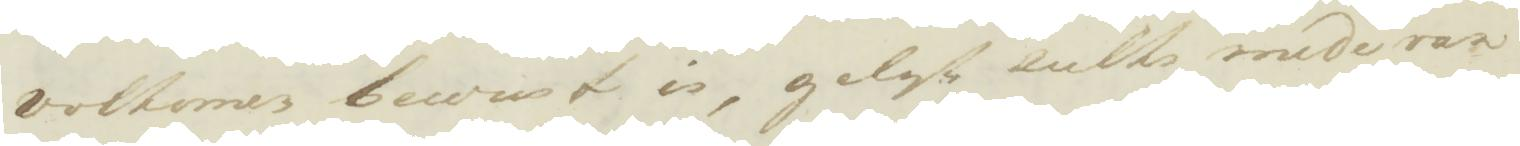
volkomen bewust is, gelijk zulk mede van
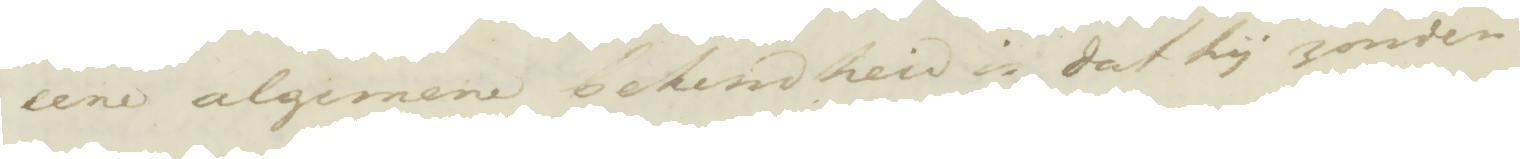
eene algemene bekendheid is dat hij zonder
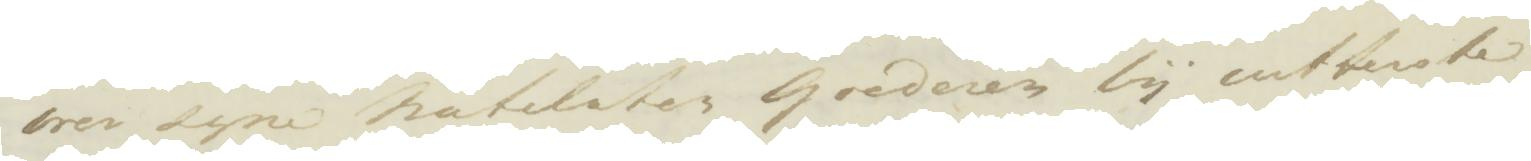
over zijne na telaten Goederen bij uitterste
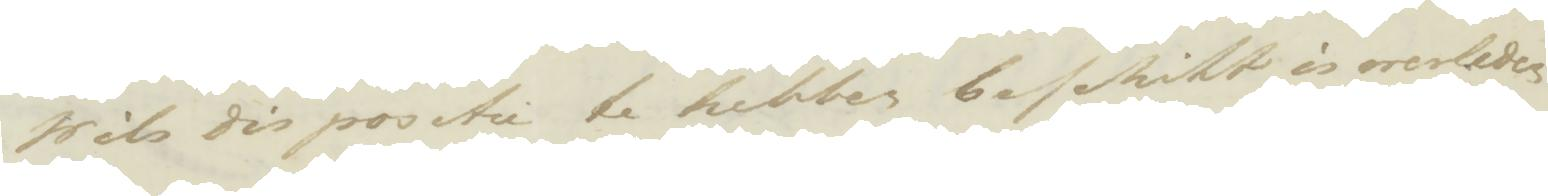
wils dispositie te hebben beschikt is overleden
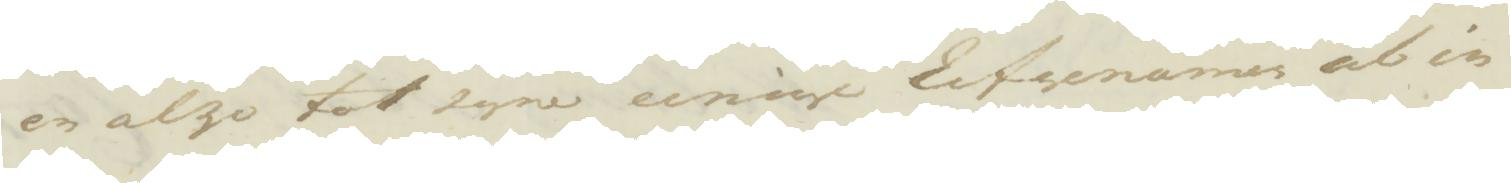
en alzo tot zijne eenige Erfgenamen ab in
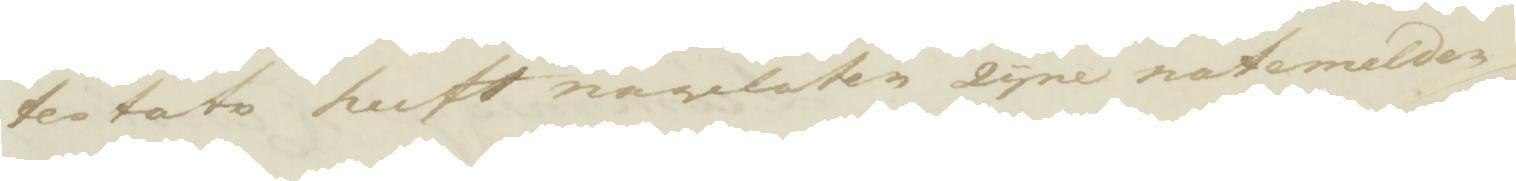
testato heeft nagelaten zijne na te melden
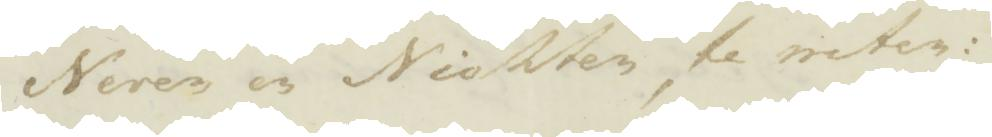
Neven en Nichten, te weten:
